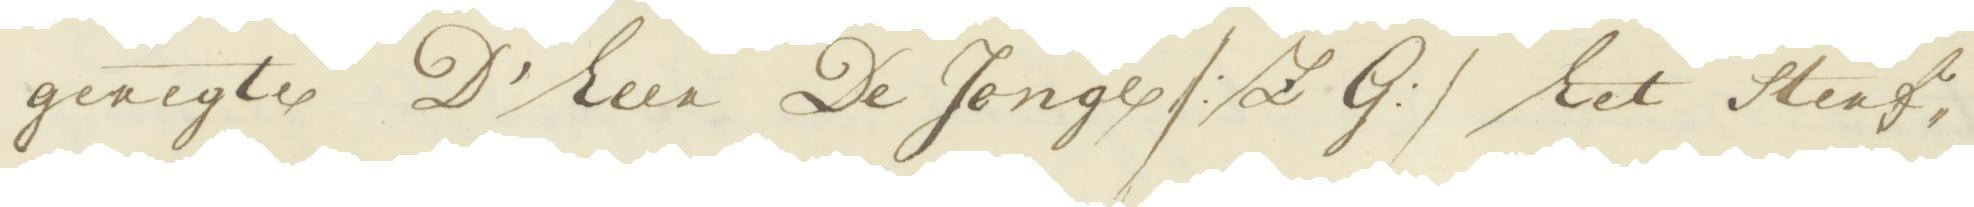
geregte D' heer De Jonge /:Z G: / het sterf„
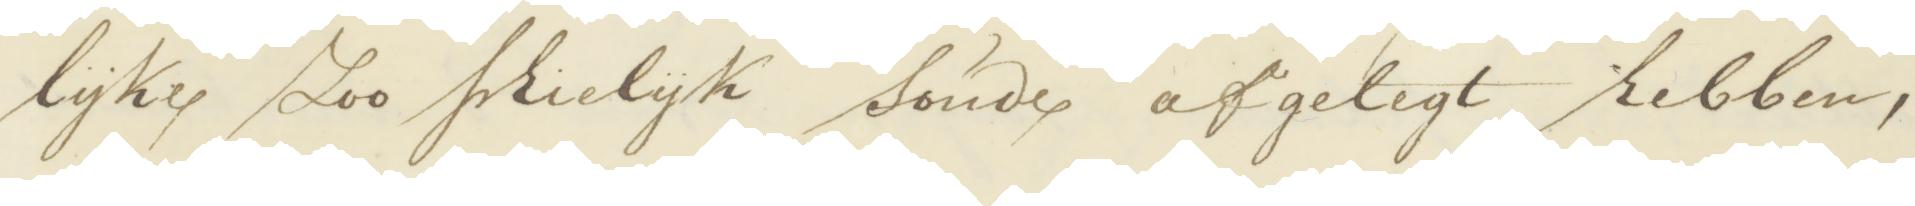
lijke Zoo Schielijk Soude afgelegt hebben,
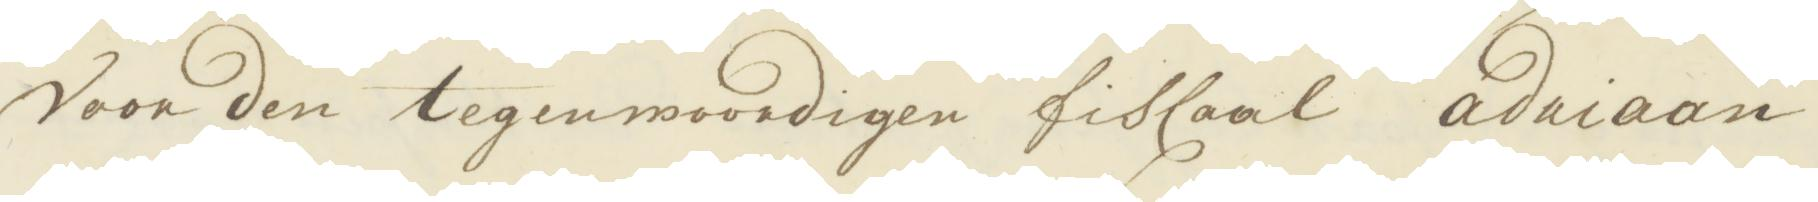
Voor den tegenwoordigen fiscaal adriaan
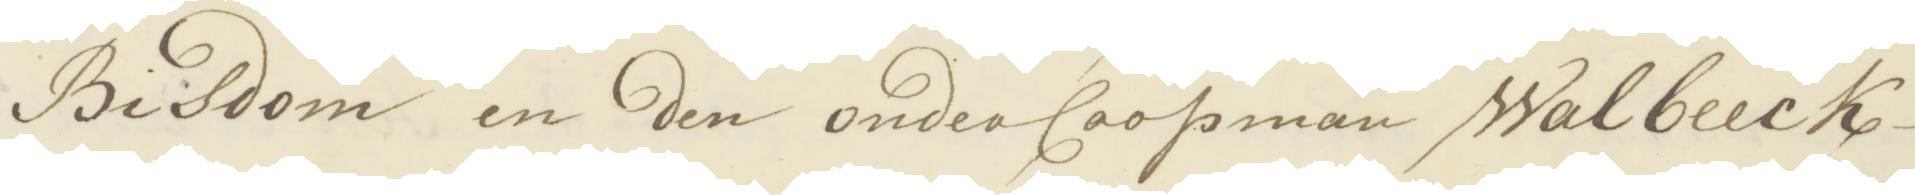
Bisdom en den onder Coopman Walbeeck
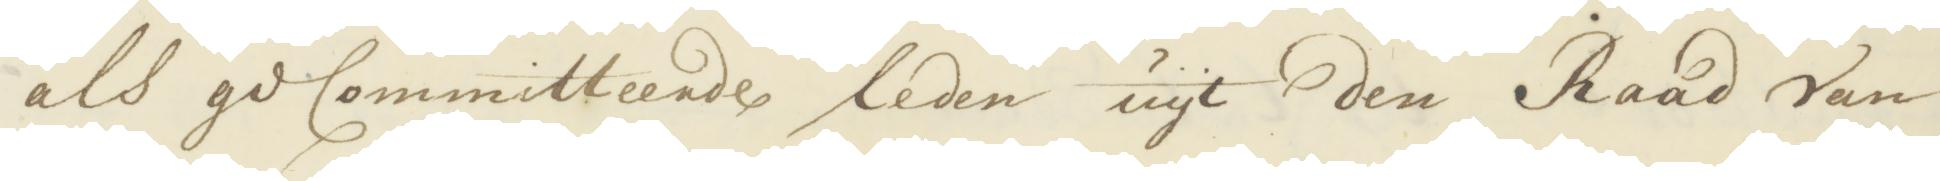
als gecommitteerde leden uijt den Raad van
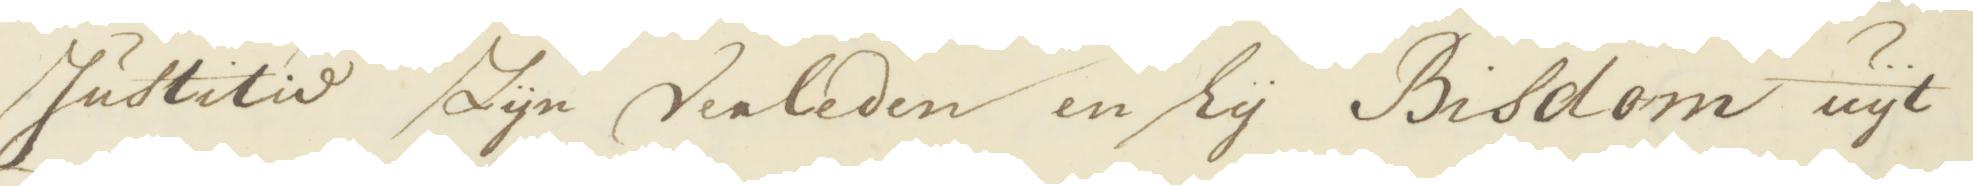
Justitie Zijn Verleden en hij Bisdom uijt
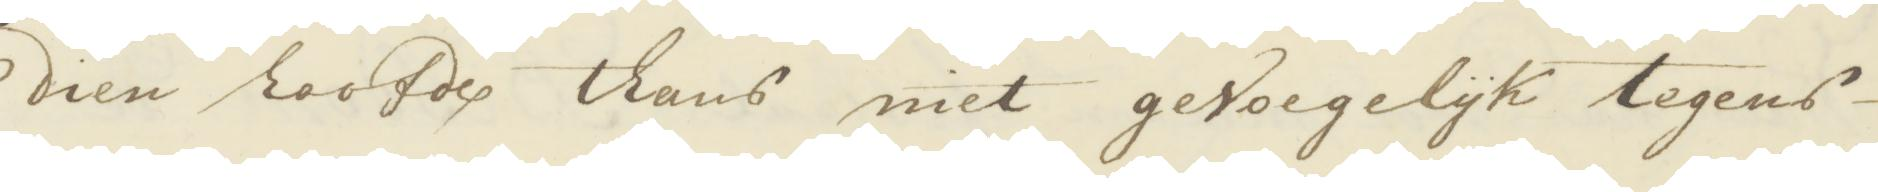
dien hoofde thans niet gevoegelijk tegens
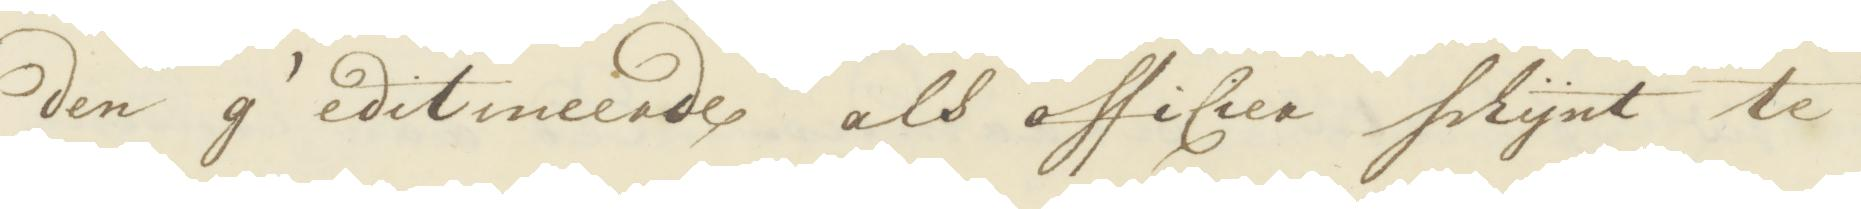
den g’ editineerde als officier schijnt te
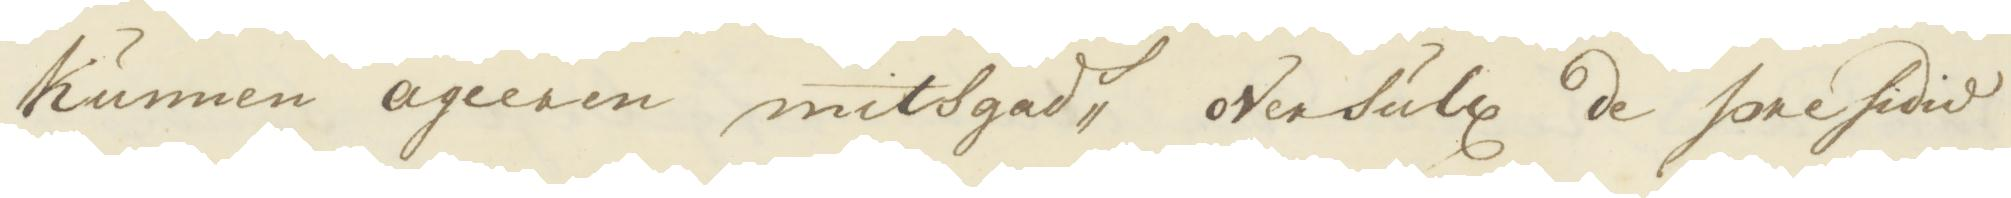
kunnen ageeren mitsgad„s oversulx de presidie
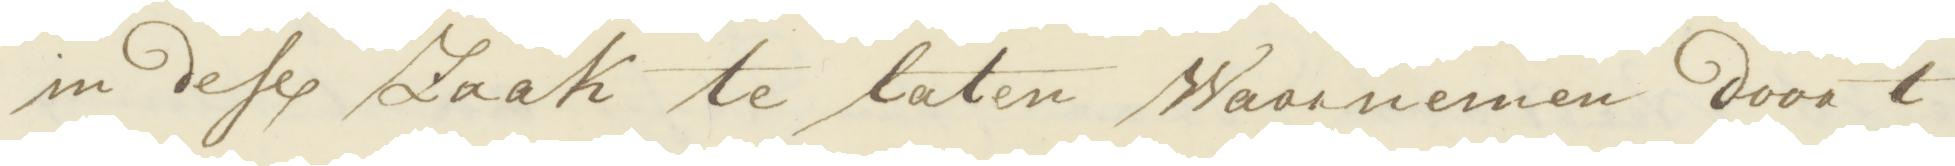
in dese Zaak te laten Waarnemen door 't
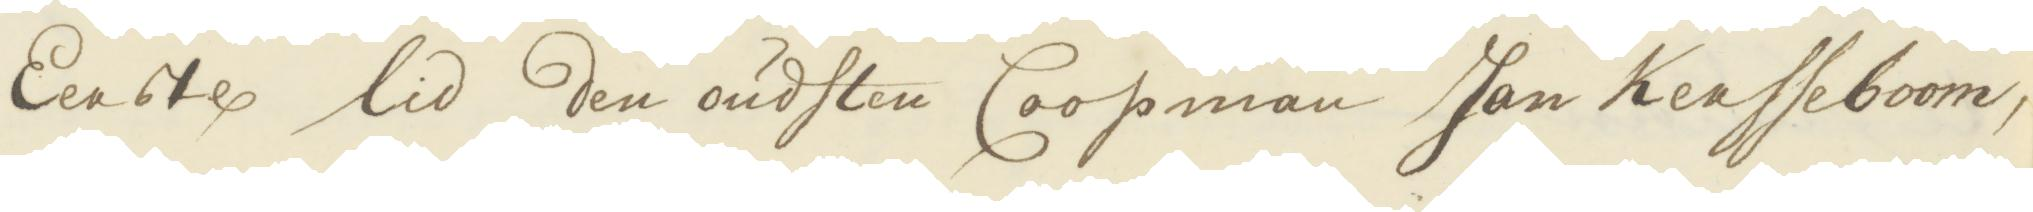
Eerste lid den oudsten Coopman Jan Kersseboom,
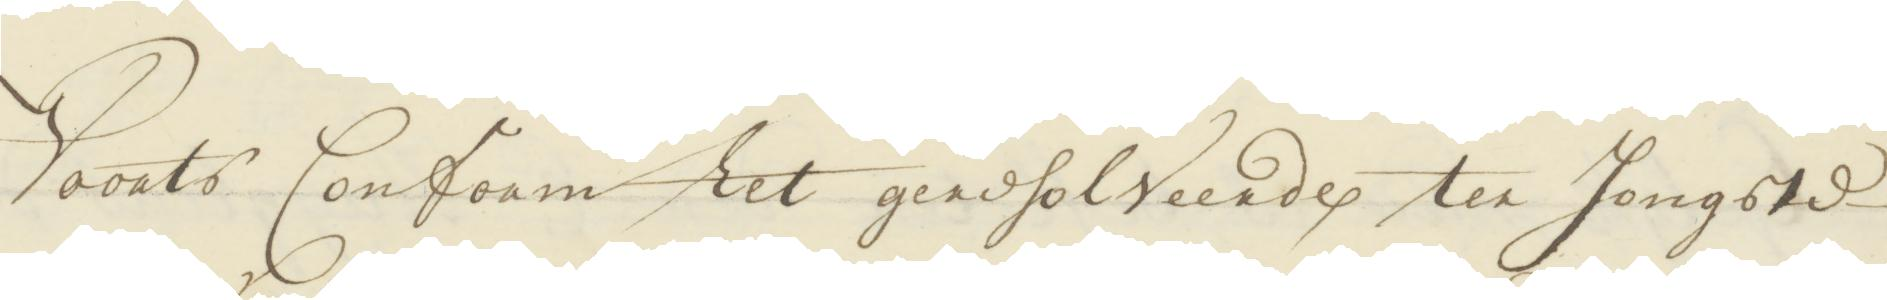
Voorts Conform het geresolveerde ter Jongste
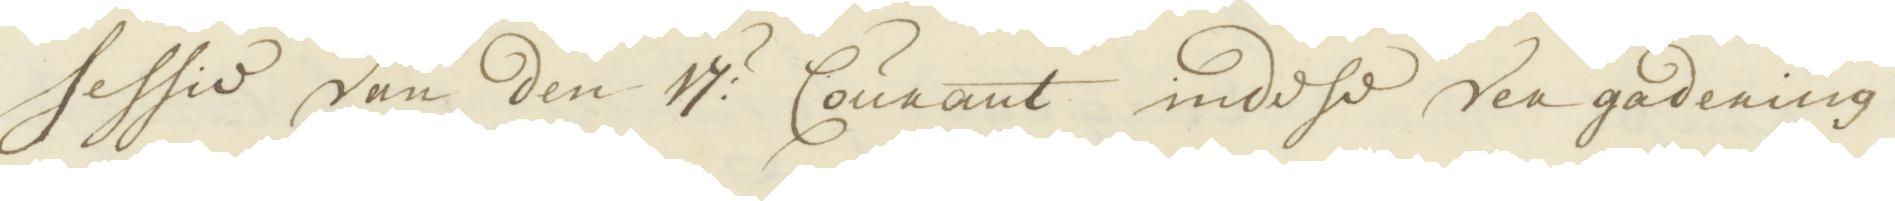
Sessie van den 17:en Courant in dese Vergadering
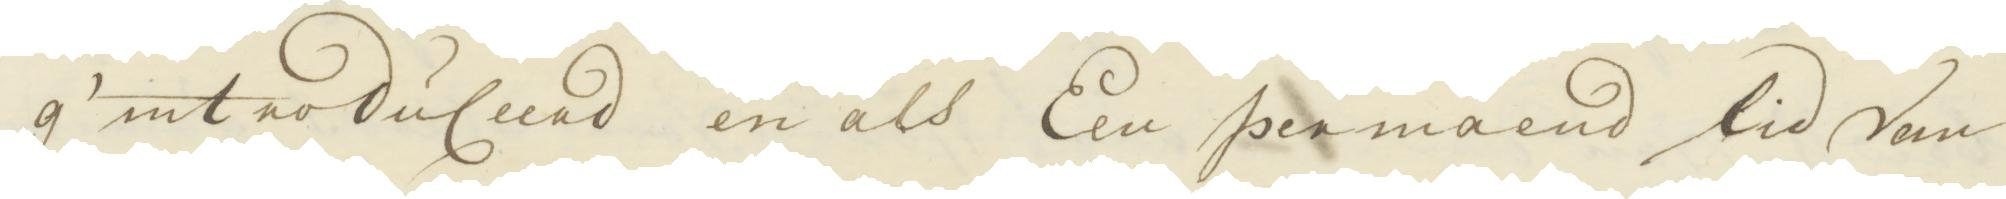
g’ introduceerd en als Een permaend lid Van
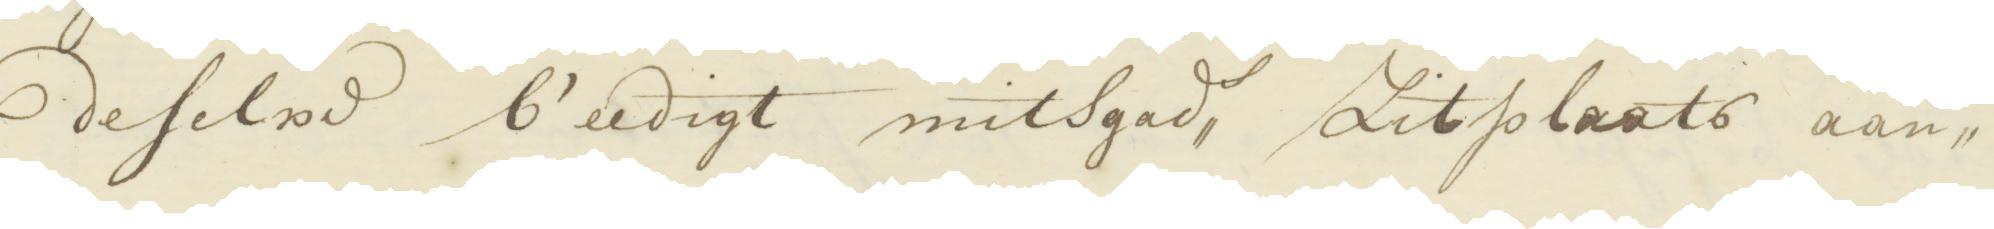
deselve b'eedigt mitsgad„s Zitplaats aan„
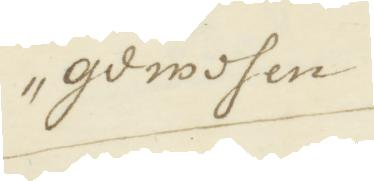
„gewesen
